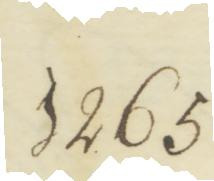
1265
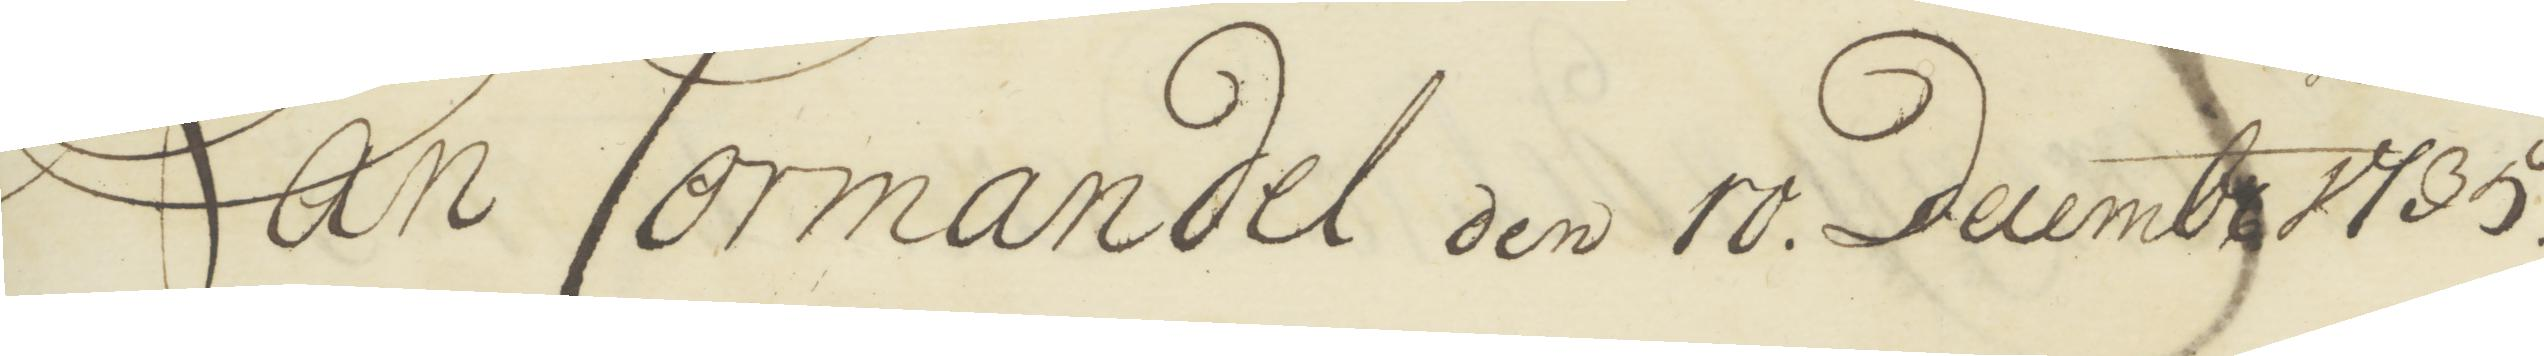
Van Cormandel den 10. Decembr 1735.
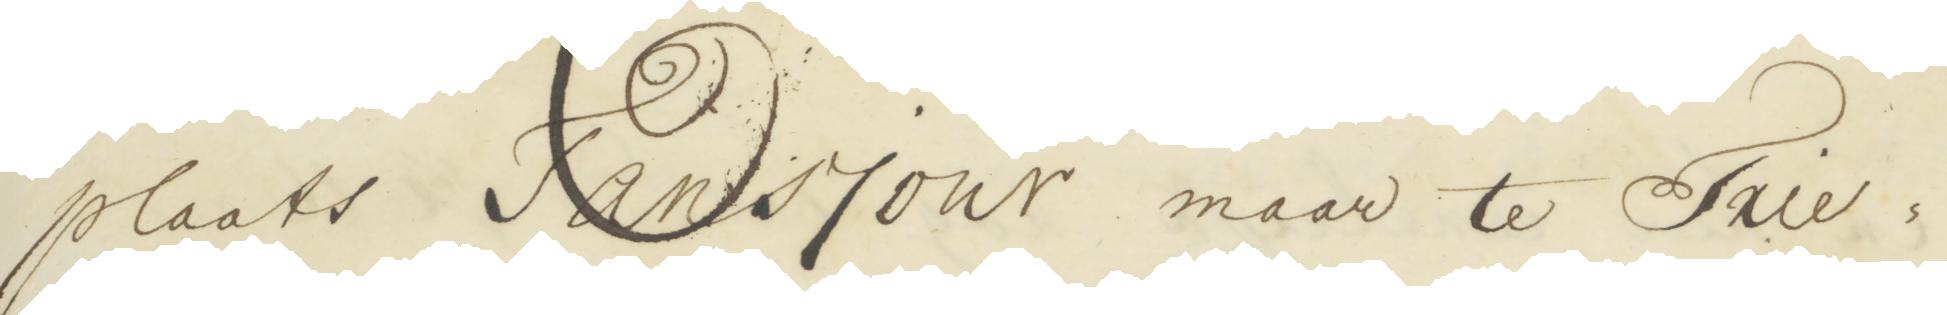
plaats Tansjour maar te Trie„
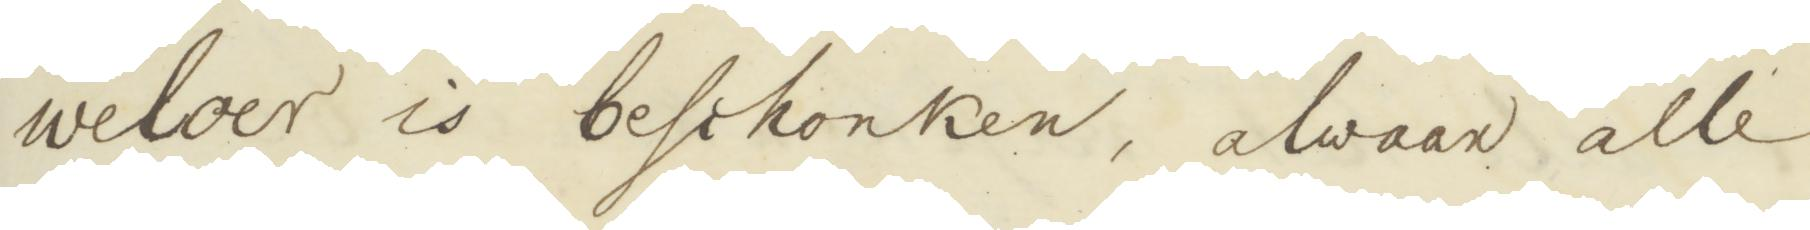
weloer is beschonken, alwaar alle
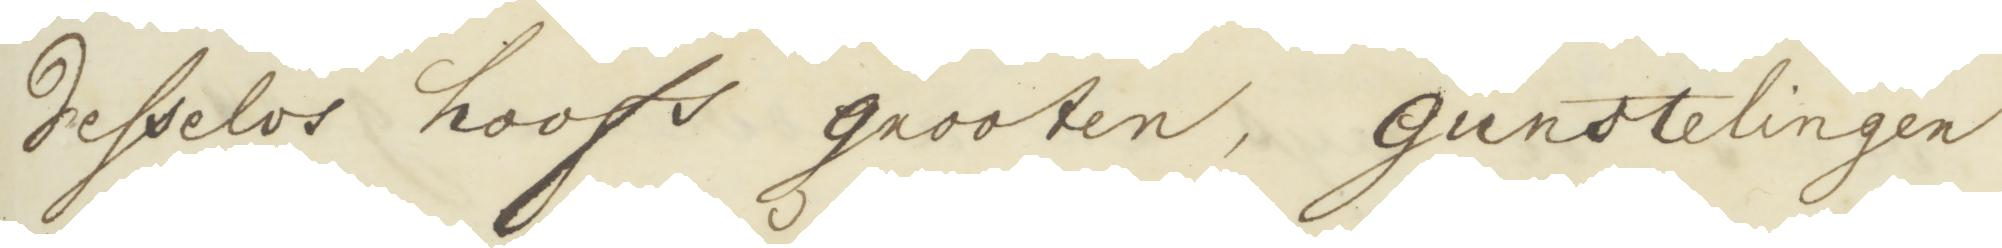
desselvs hoofs grooten, gunstelingen
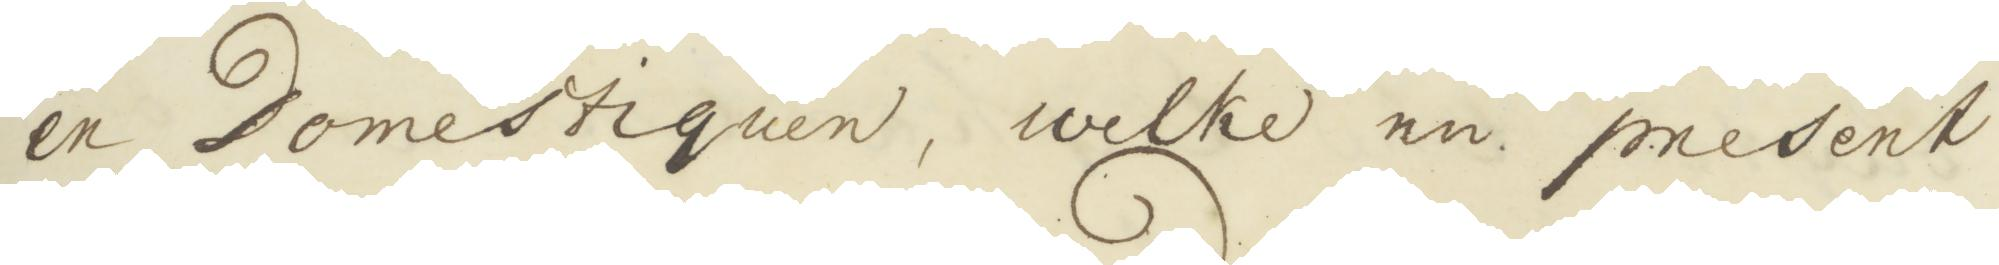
en Domestiquen, welke nu present
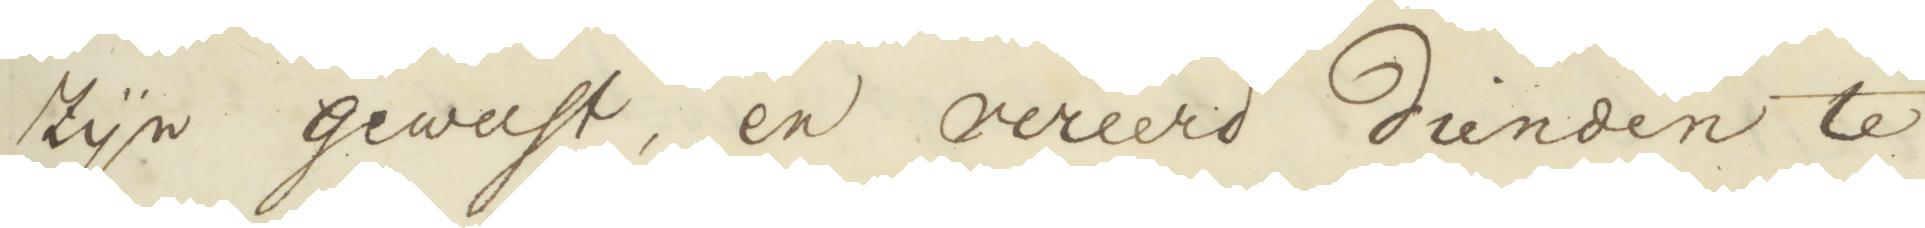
zijn geweest, en vereerd dienden te
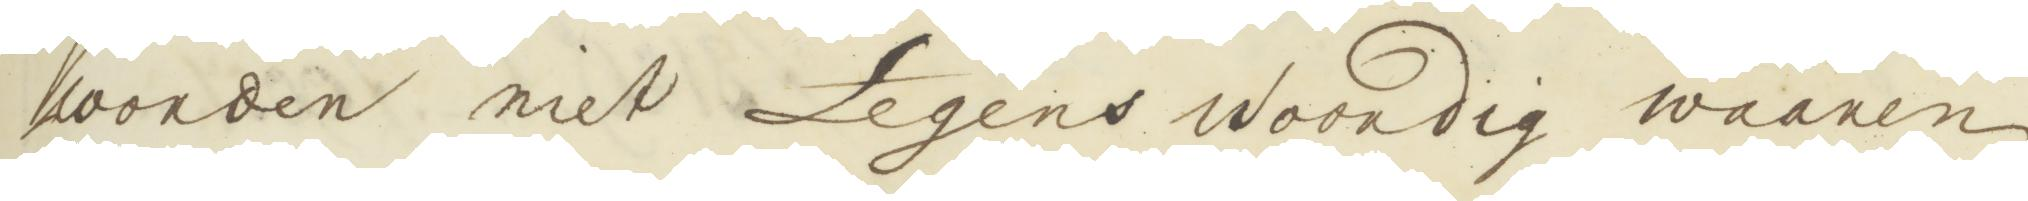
worden niet tegens woordig waaren
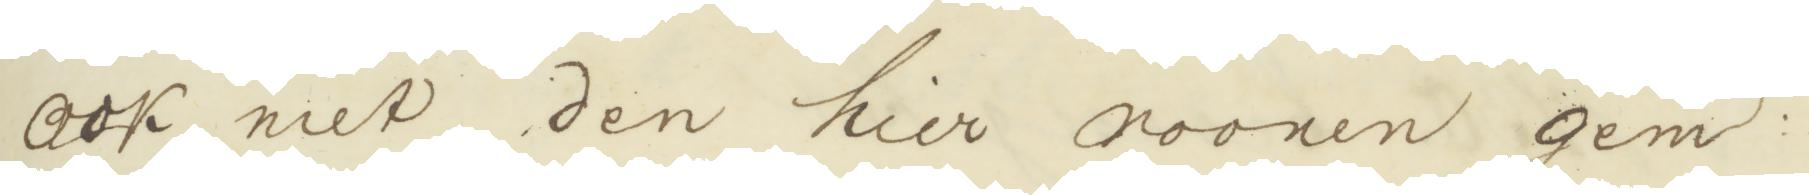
ook niet den hier vooren gem:
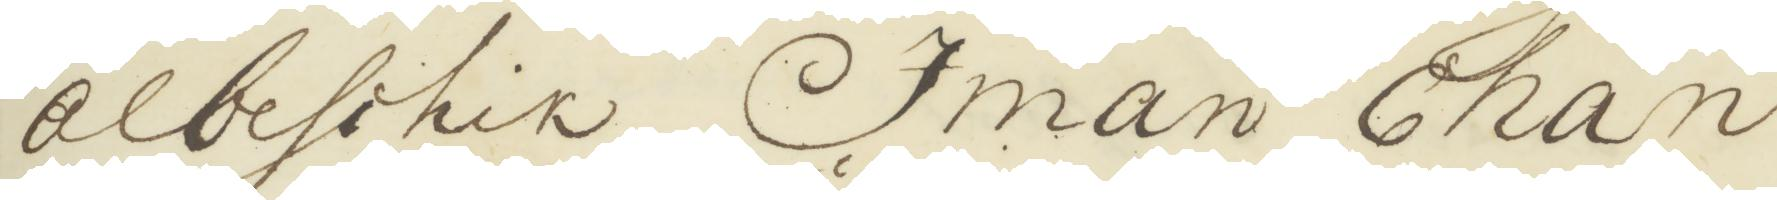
albeschik Jman Chan
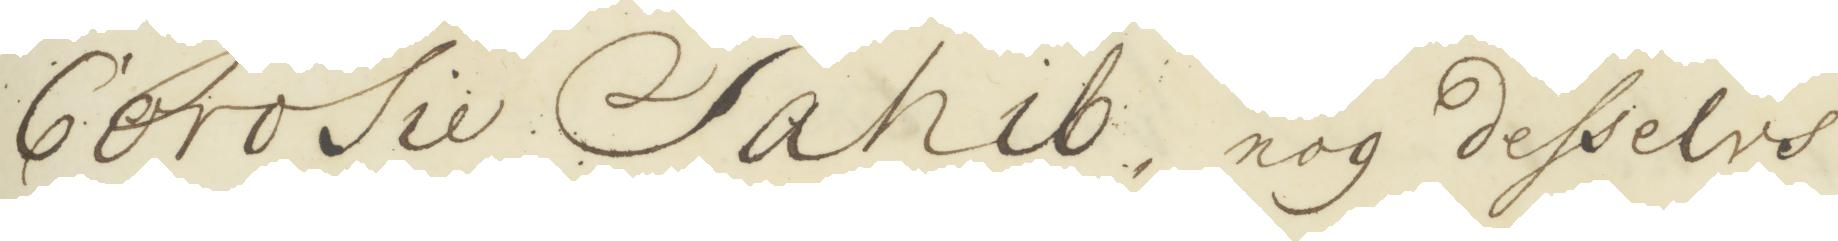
Corosie Sahib, nog desselvs
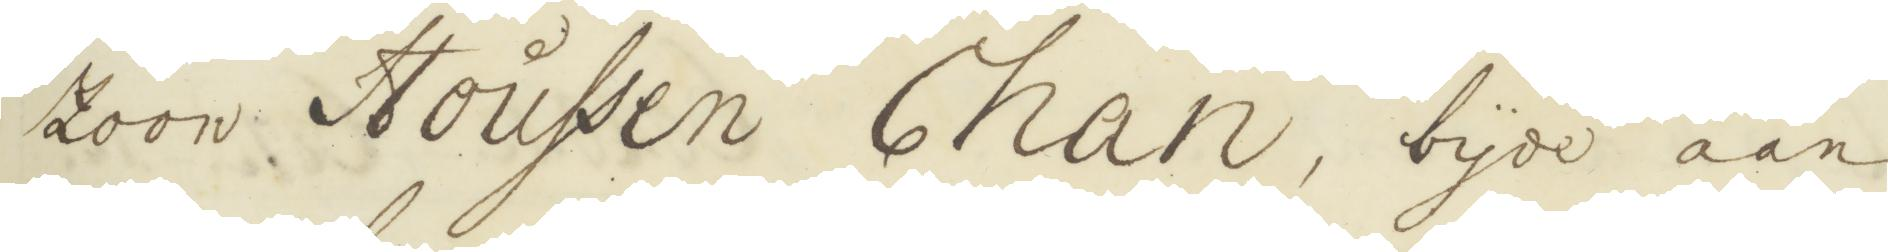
zoon Houssen Chan, bijde aan
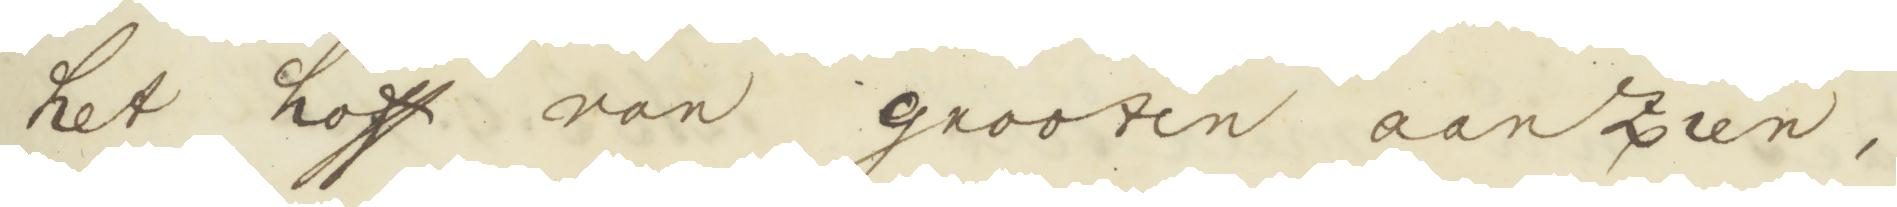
het hoff van grooten aanzien,
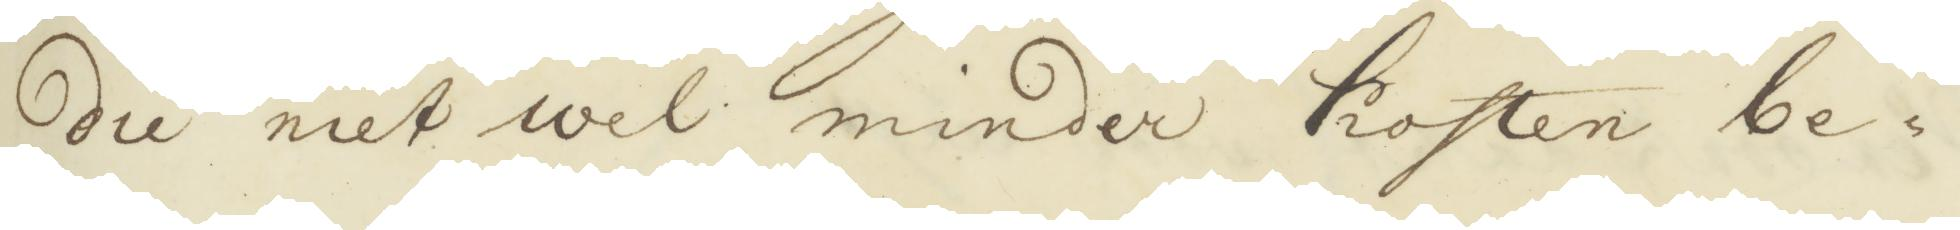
die niet wel minder kosten be„
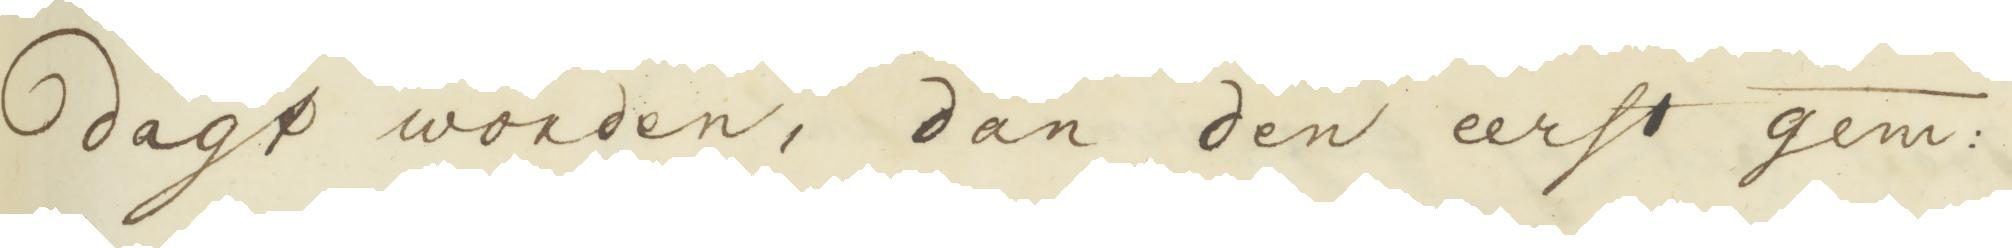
dagt worden, dan den eerst gem:
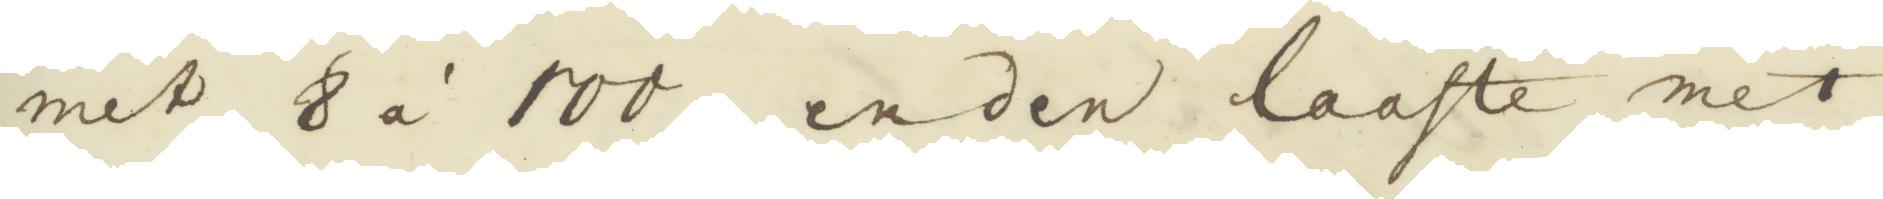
met 8 a' 100. en den laaste met
